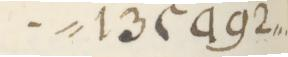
= „ 135492„
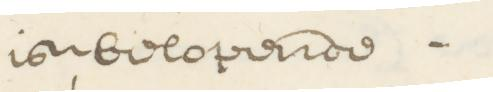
is belopende - - - - - - - - - - - -
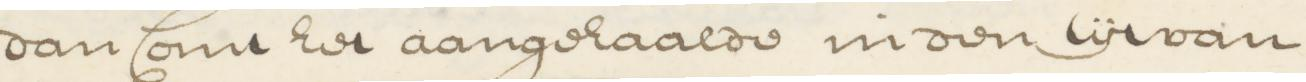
dan Cont het aangehaalde in den tijt van
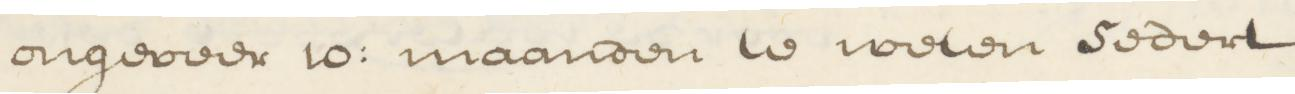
ongeveer 10: maanden te weten sedert
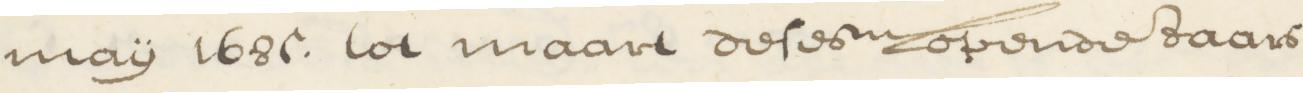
maij 1685. tot maart deses Lopende Iaars
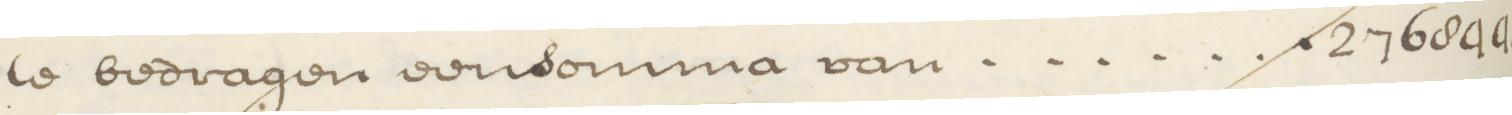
te bedragen een somma van - - - - - .ƒ276844
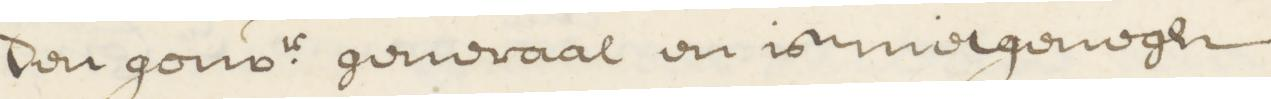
van gouv.r generaal en is niet genegen
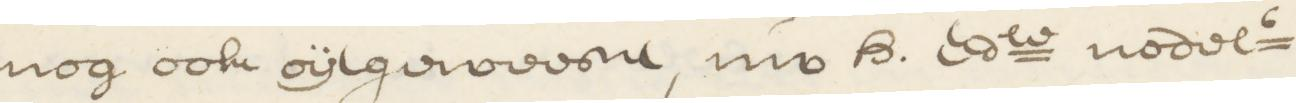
nog ook oijtgeweest, nu h. Ed=le nodel=s
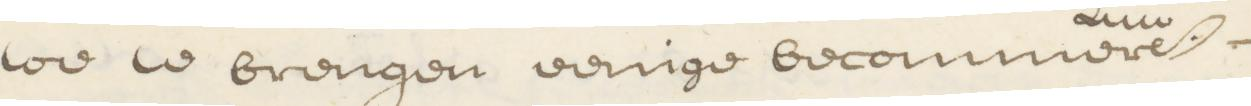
toe te brengen eenige becommerlijk.
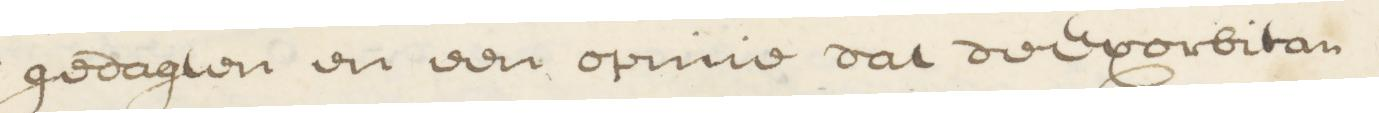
gedagten en een opinie dat de Exorbitan
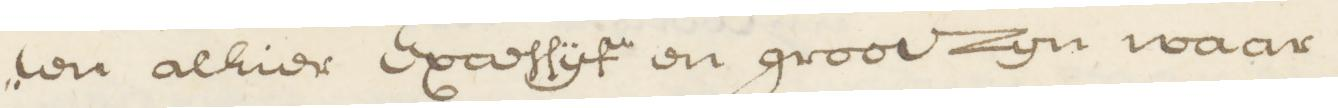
„ten alhier Excessijf en groot zyn waar
